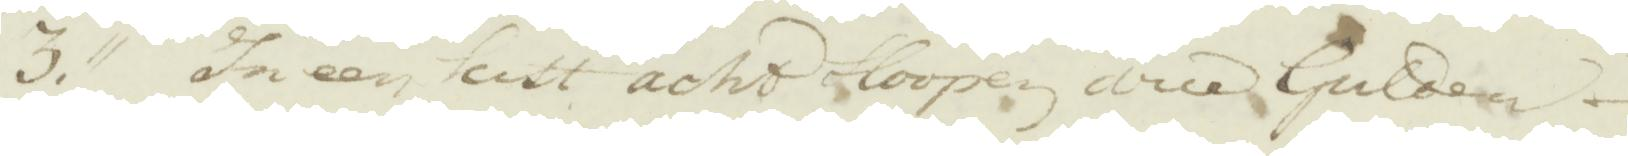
3.„ In een kist acht sloopen drie Gulden-
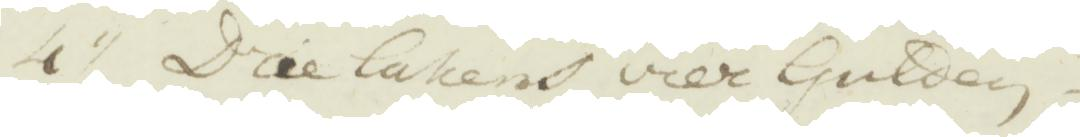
4„ Drie lakens vier Gulden
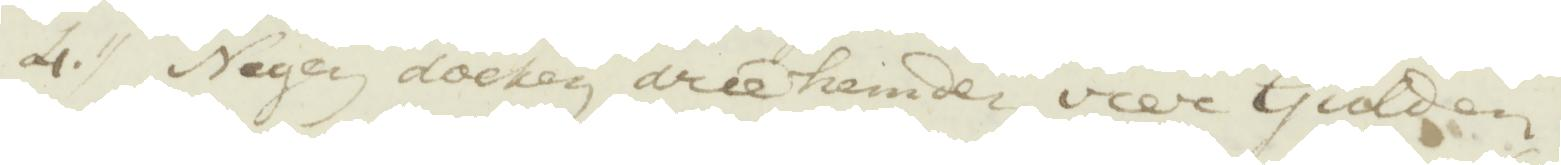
4.„ Negen doeken drie hemden vier Gulden
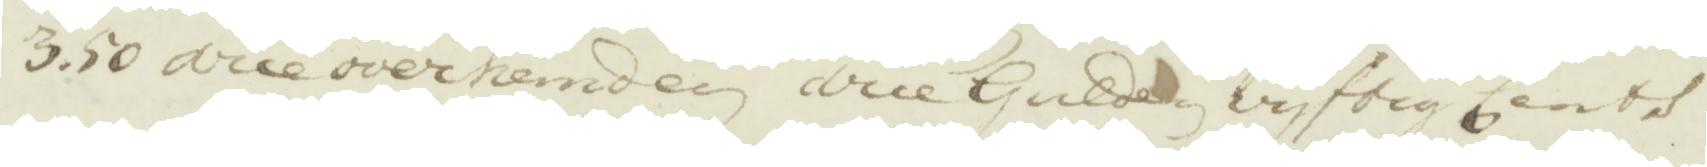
3.50 drie overhemden drie Gulden vyftig Cents
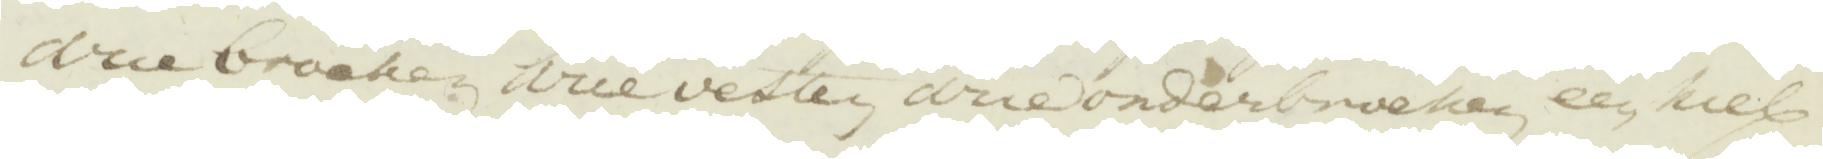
drie broeken drie vesten drie onderbroeken een kiel
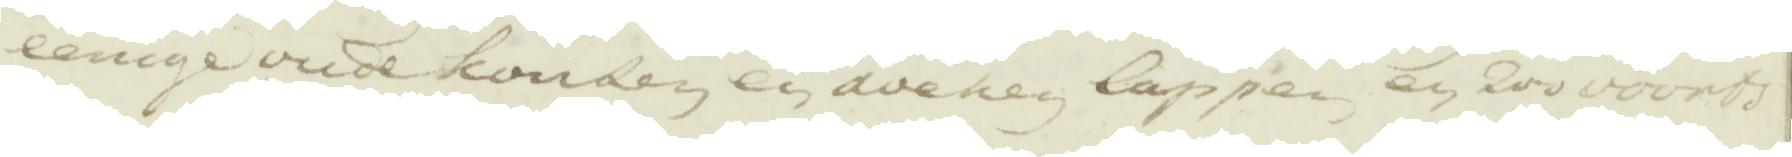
eenige oude kouzen en doeken lappen en zoo voorts
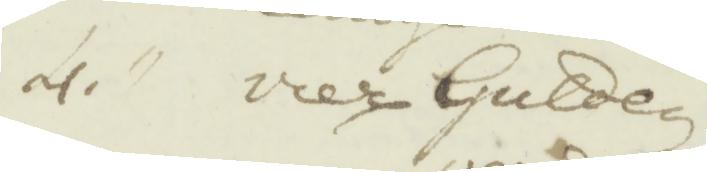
4.„ vier Gulden
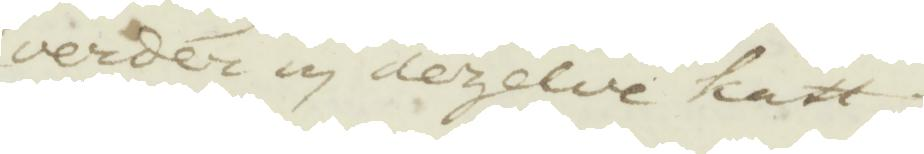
verder in dezelve kast
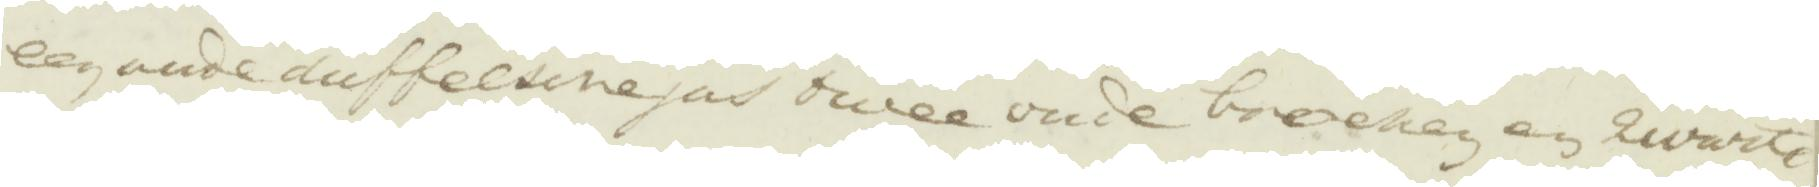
een oude duffelschejas twee oude breeken en zwarte
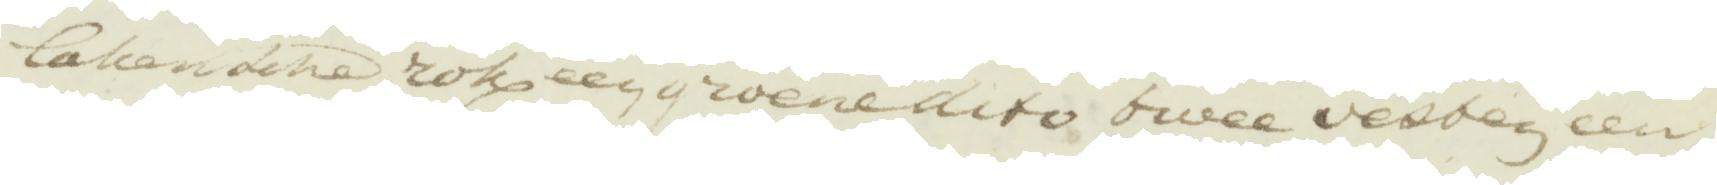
lakensche rok een groene dito twee vesten een
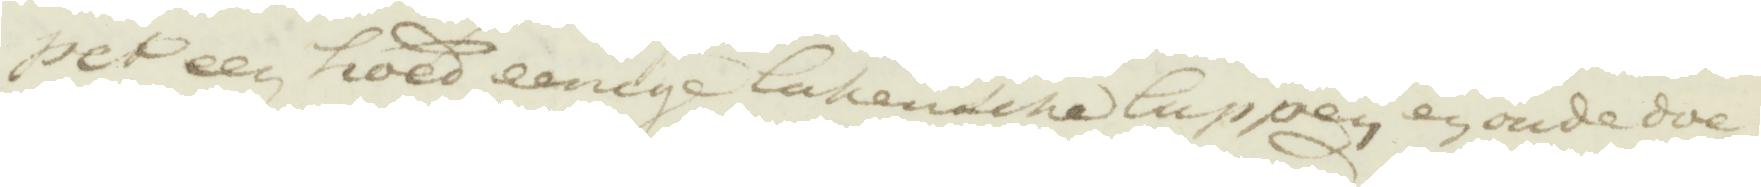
pet een hoed eenige lakensche lappen en oude doe
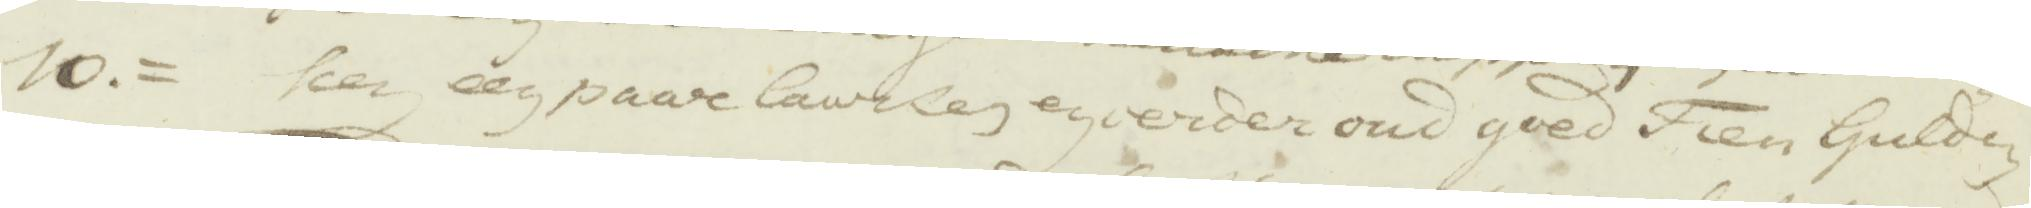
10.= ken een paar laarzen en verder oud goed Tien Gulden
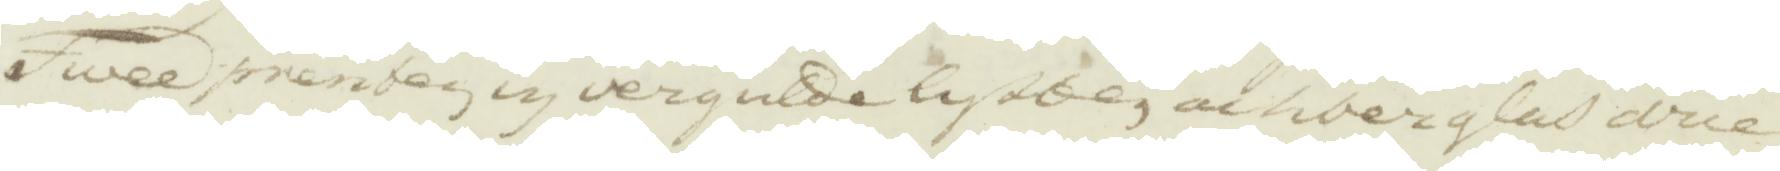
Twee prenten in vergulde lysten achter glas drie
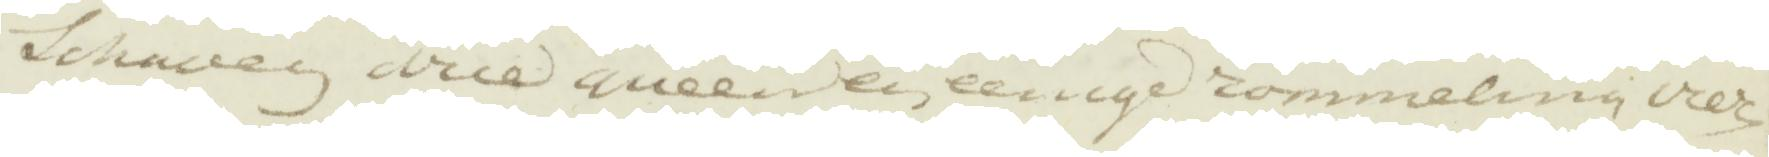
schaven drie aneen en eenige rommeling vier
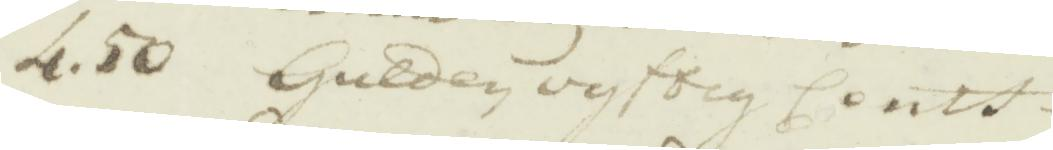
4.50 Gulden vyftig Cents
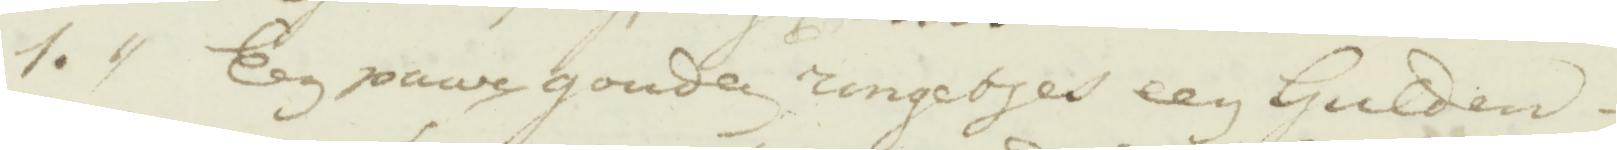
1. „ Een paar gouden ringetjes een Gulden
